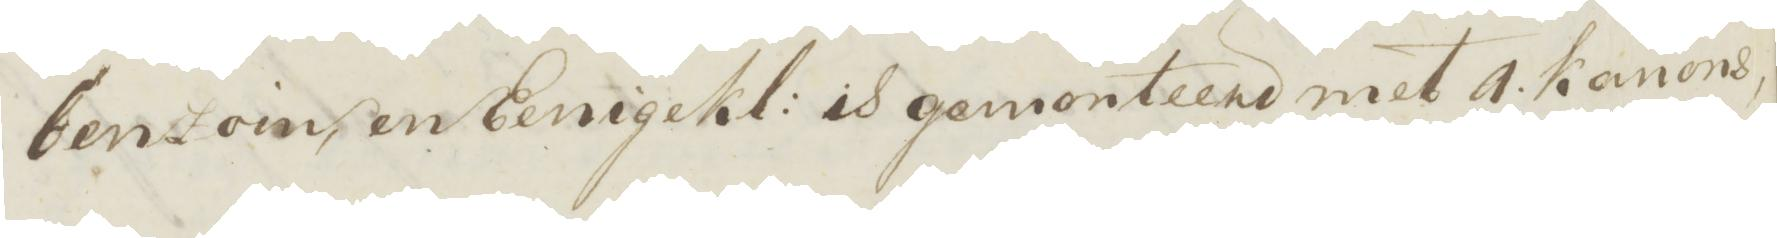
benzoin, en Eenige kl: is gemonteerd met 4. kanons,
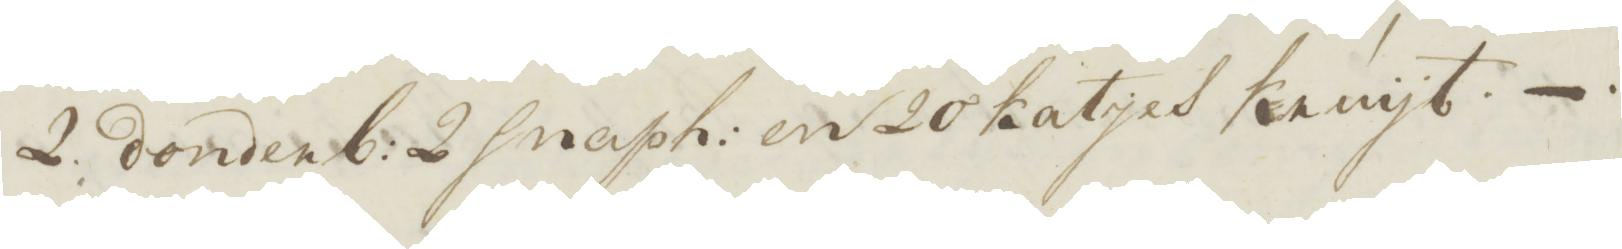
2. donderb: 2 snaph: en 20 katjes kruijt. —
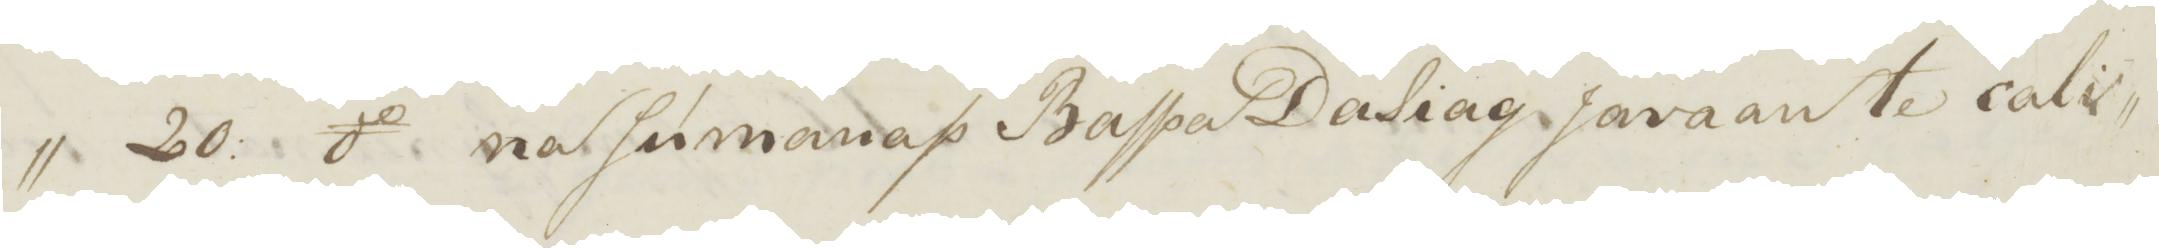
„ 20: d=o na sumanap Bappa Dasiag Javaan te cali„
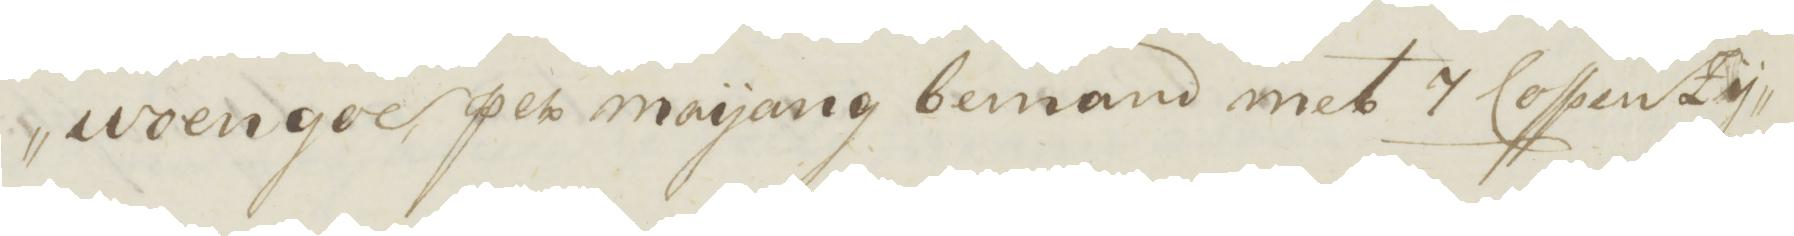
„woengoe, per maijang bemand met 7 Coppen zij„
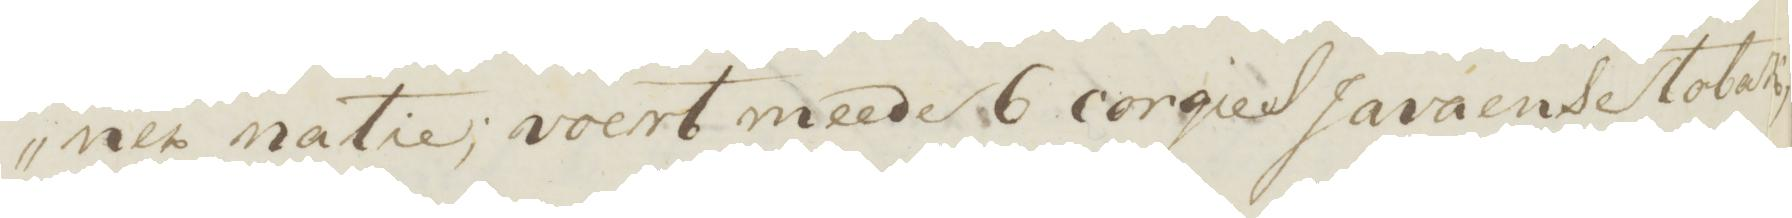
„ner natie; voert meede 6 corgies Javaense tobak,
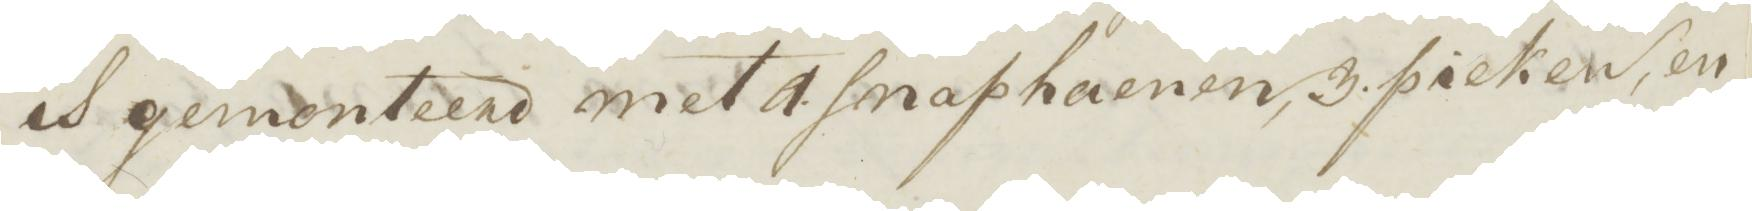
is gemonteerd met 4. snaphaenen, 3. pieken, en
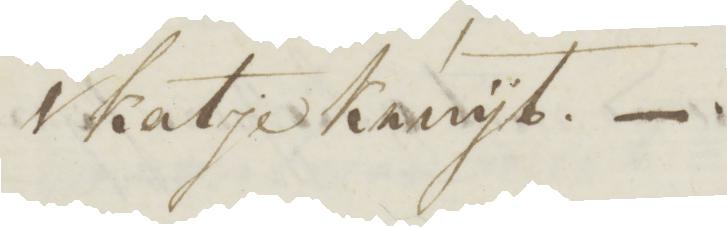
1 katje kruijt. —
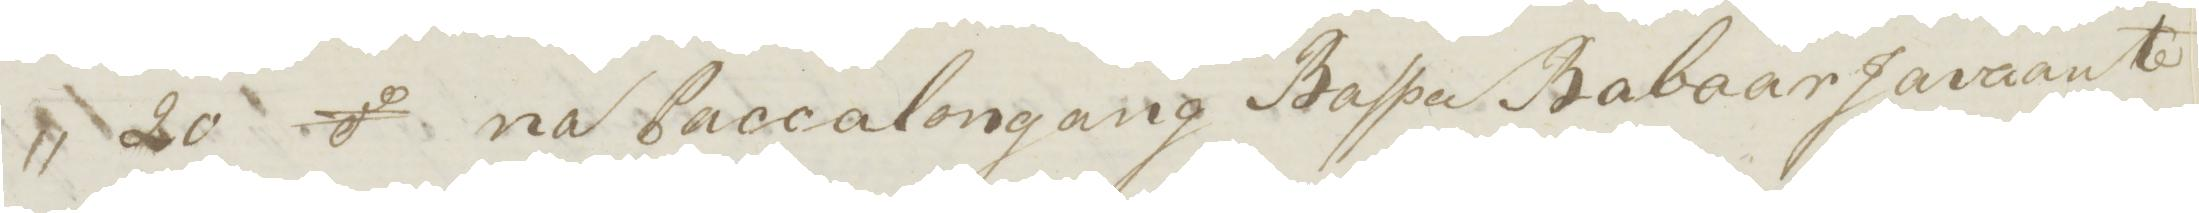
„ 20 d=o na Paccalongang Bappa Babaar Javaan te
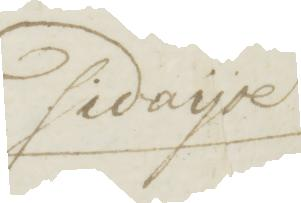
sidaijoe
